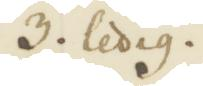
3. ledig.
